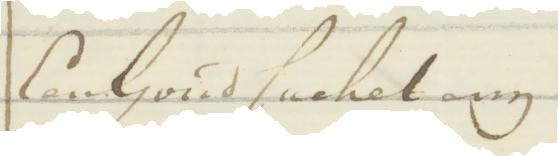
Een Goud Cachet enz
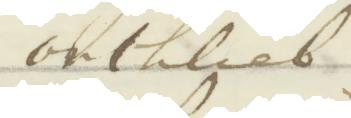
orthlieb
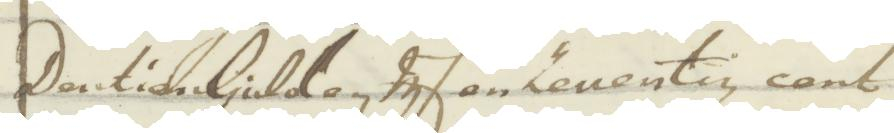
Dertien Gulden vyf en zeventig cent
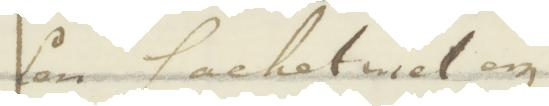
Een Cachet met enz
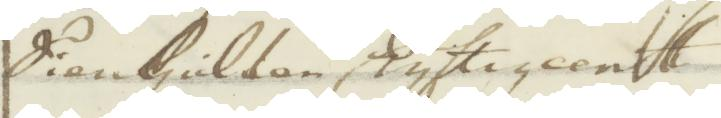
Vier Gulden vyftig cent
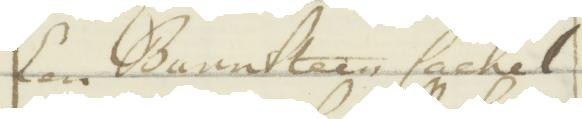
Een Barnsteen Cachet
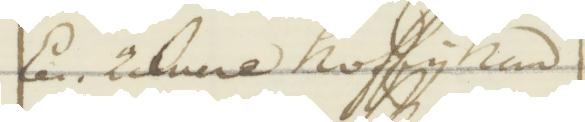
Een zilvere koffijkan
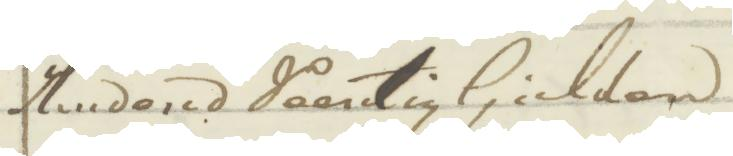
Honderd Veertig Gulden
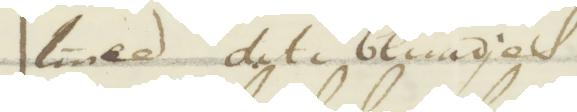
twee dito blaadjes
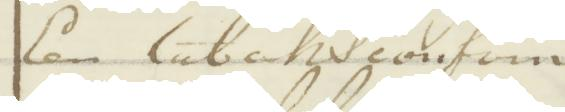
Een tabaksconfoir
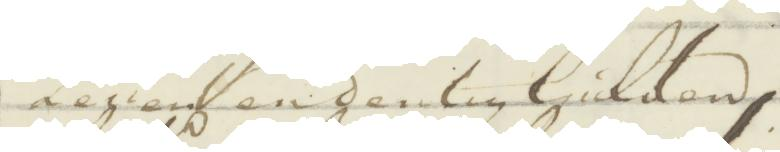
Zeven en dertig Gulden
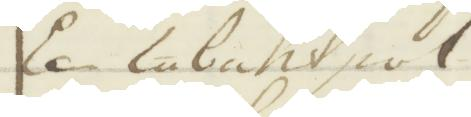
Een tabakspot
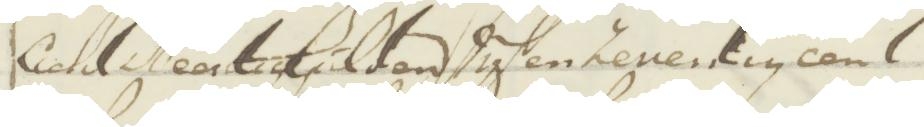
Acht en Veertig Gulden vyf en zeventig cent
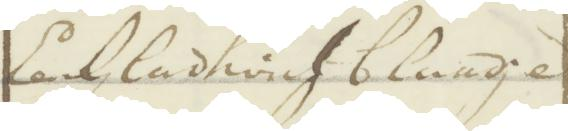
Een Gladhout blaadje
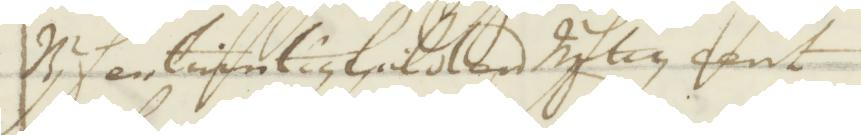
Vyf en twintig Gulden Vyftig Cent
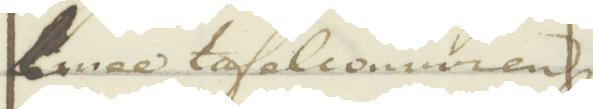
twee tafelconvoren
